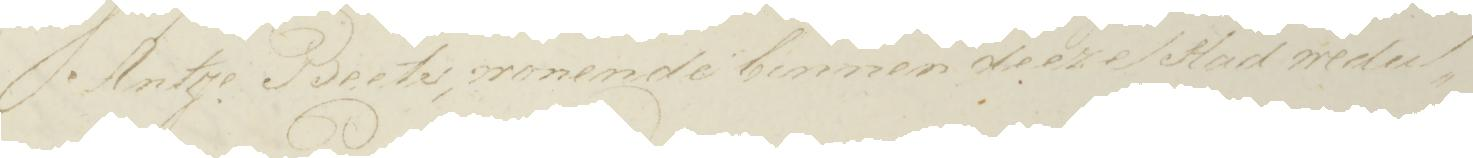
Antje Beets, wonende binnen deeze stad wedu„
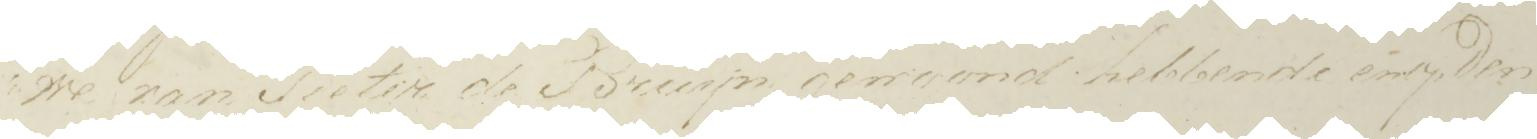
"we van Pieter de Bruijn, gewoond hebbende en op den
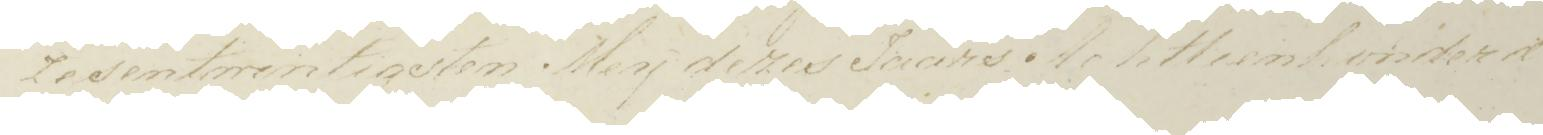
zesentwintigsten Meij dezes Jaars Achttien honderd
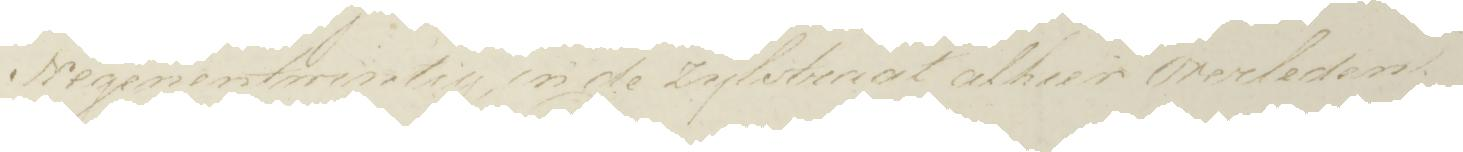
Negenentwintig, in de zylstraat alhier overleden.
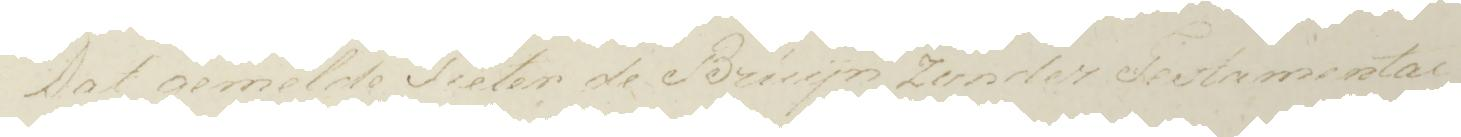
Dat gemelde Pieter de Bruijn zonder Testamentai
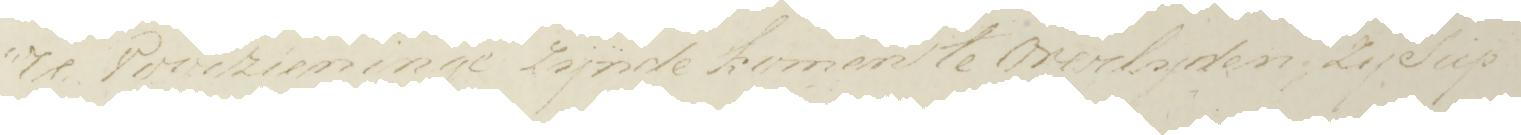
"re voorzieninge zijnde komen te overlyden, zy sup
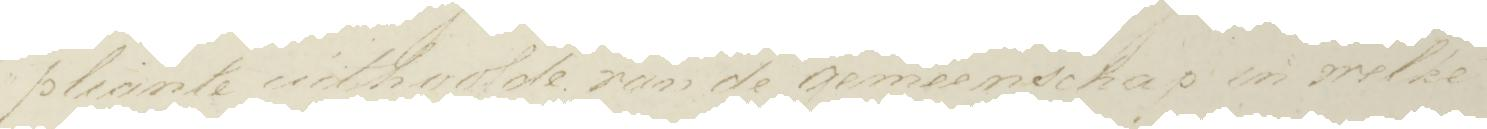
pliante uit hoofde van de gemeenschap in welke
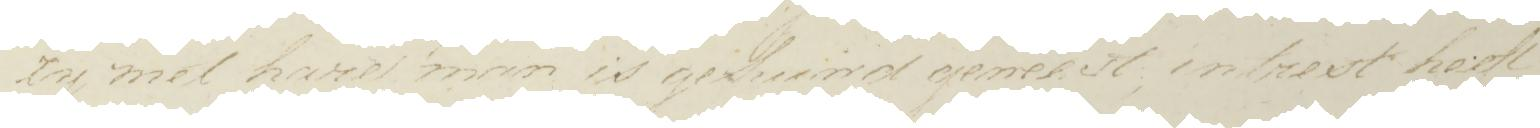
zy met hare man is gehuwd geweest, intrest heeft
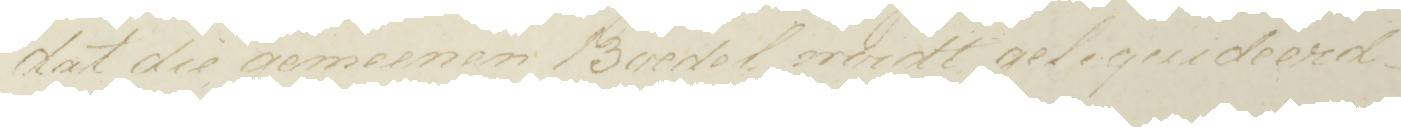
dat die gemeenen Boedel wordt geliquideerd.
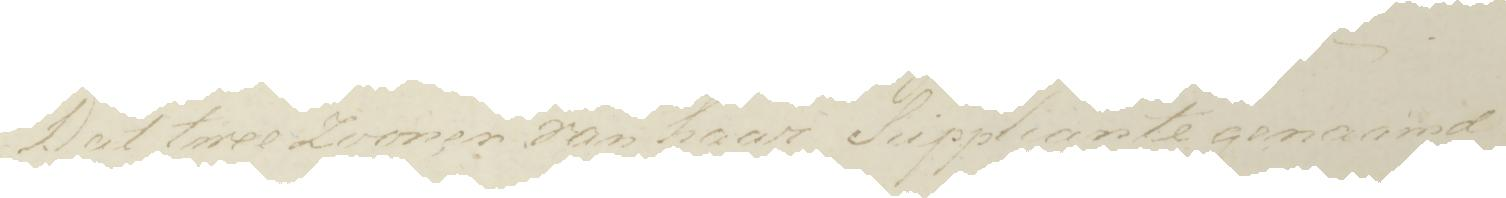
Dat twee zoonen van haar suppliante genaamd
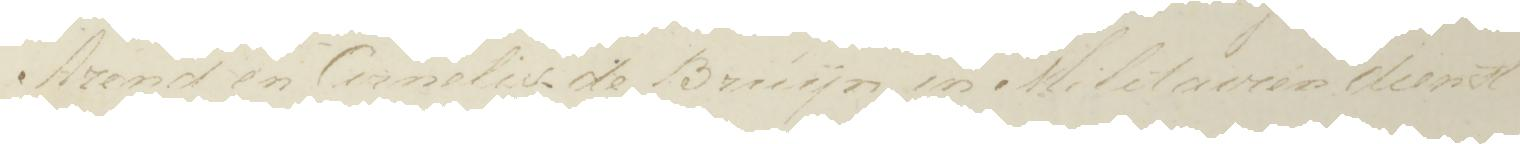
Arend en Cornelis de Bruijn, in Militaire dienst
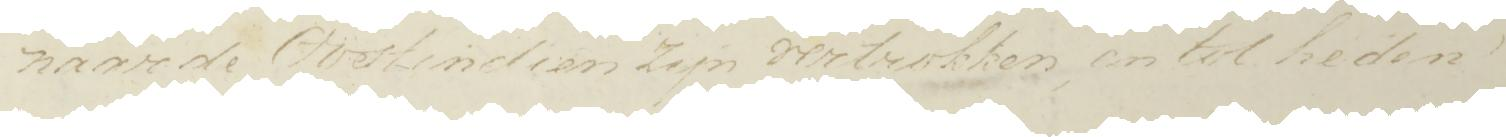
naar de Oostindien zyn vertrokken, en tot heden
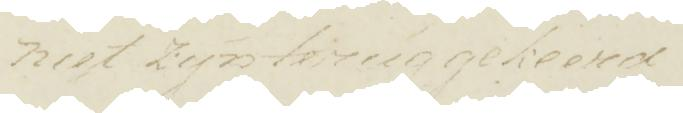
niet zyn terug gekeerd
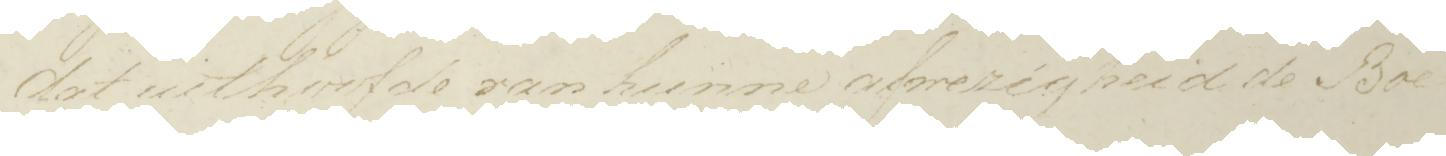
dat uithoofde van hunne afwezigheid de boe
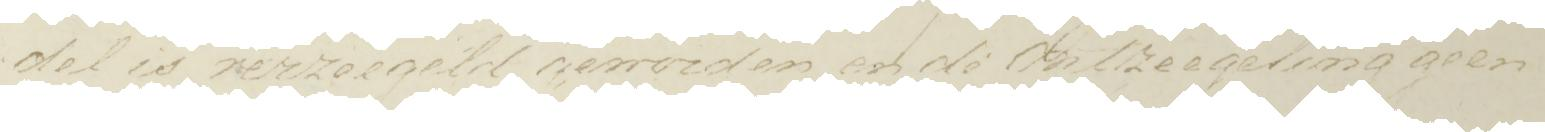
del is verzegeld geworden, en de ontzeegeling geen
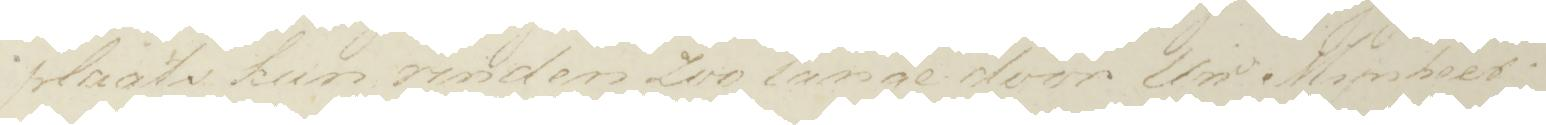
plaats kan vinden zoo lange door Uns Myn heer
